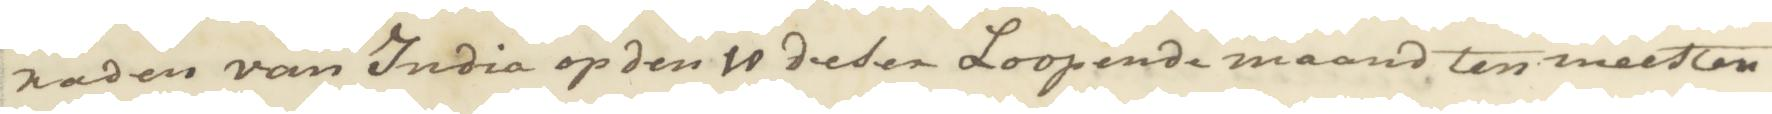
raden van India op den 10 deser Loopende maand ten meesten
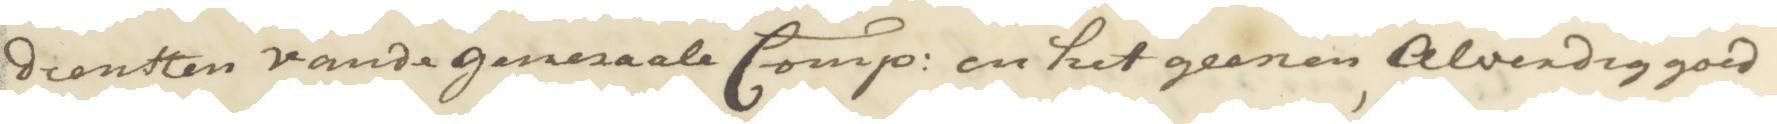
diensten vande generaale Comp: en het geenen alverdig goed
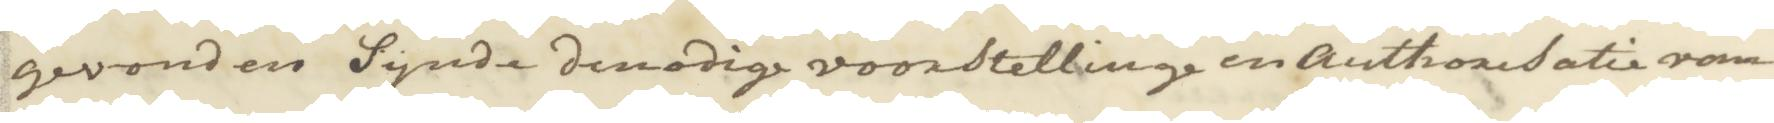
gevonden sijnde denodige voorstellinge en authorisatie van
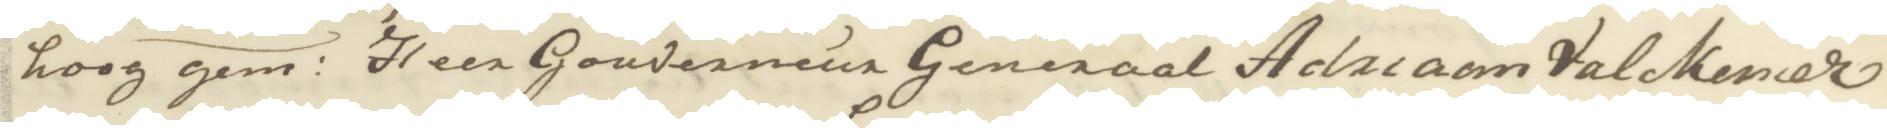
hoog gem: Heer Gouverneur Generaal Adriaan Valckenier
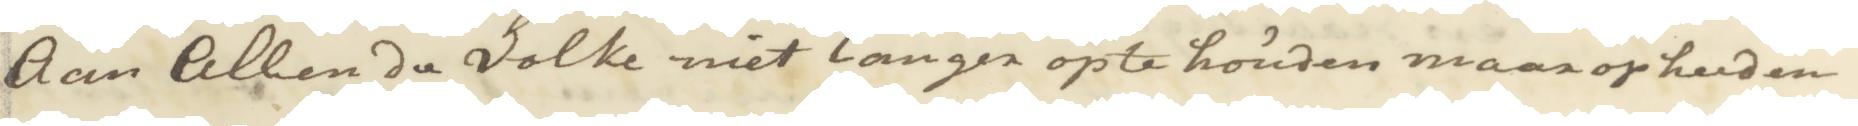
aan allen de volke niet langer op te houden maar op heeden
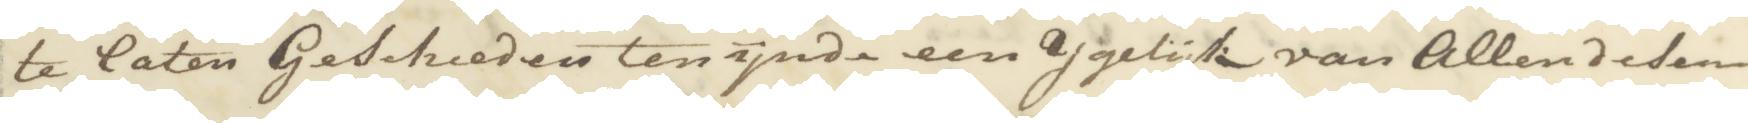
te laten Geschieden ten ijnde een Ygelijk van allen desen
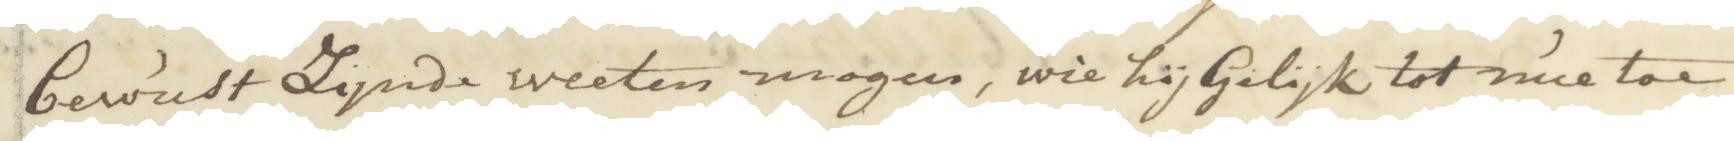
bewust zijnde weeten mogen, wie hij Gelijk tot nue toe
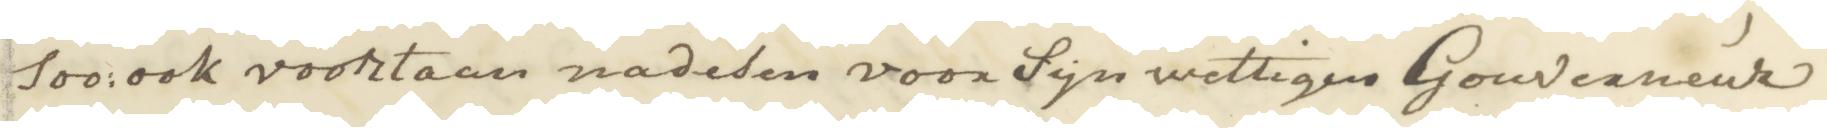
soo: ook voortaan nadesen voor sijn wettigen Gouverneur
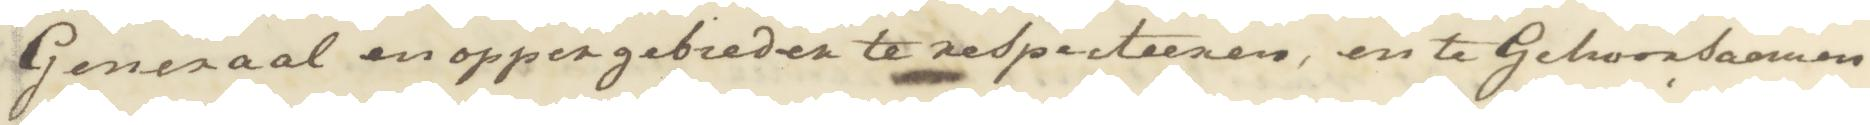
Generaal en oppergebieder te respecteeren, en te Gehoorsaamen
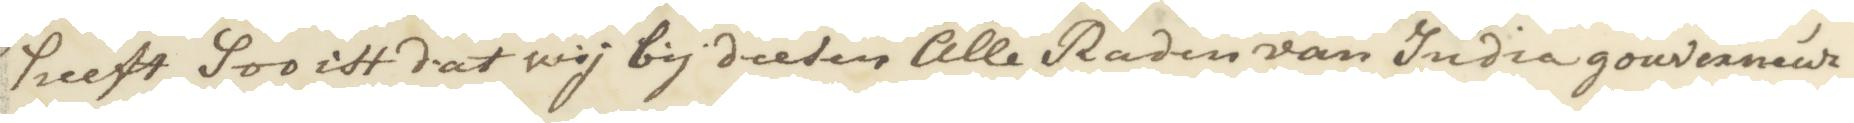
heeft soo ist dat wij bij deesen alle Raden van India gouverneur
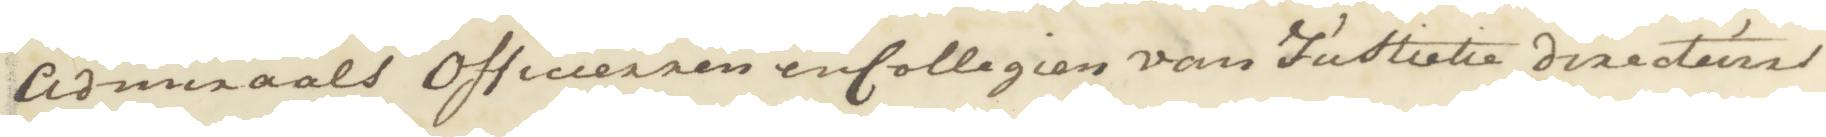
admiraals officierren en Collegien van Iustietie directeurs
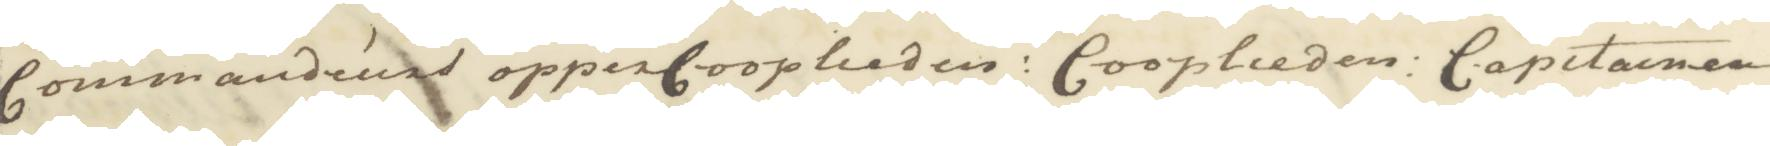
commandeurs oppercooplieden: cooplieden: capitainen
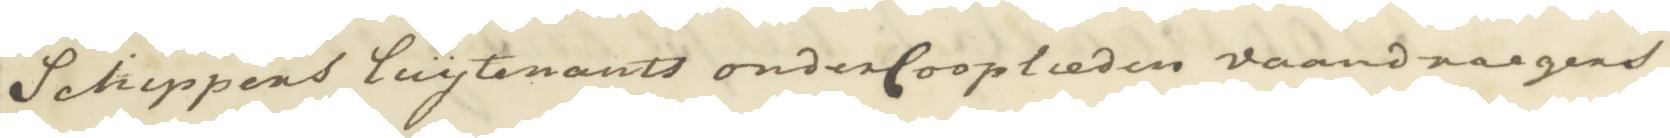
schippers luijtenants ondercooplieden vaandraegers
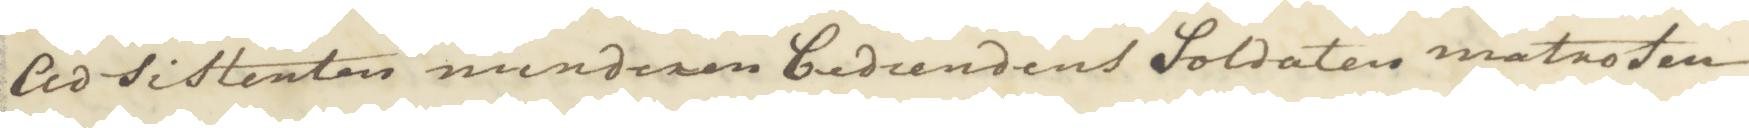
adsistenten minderen bediendens soldaten matrosen
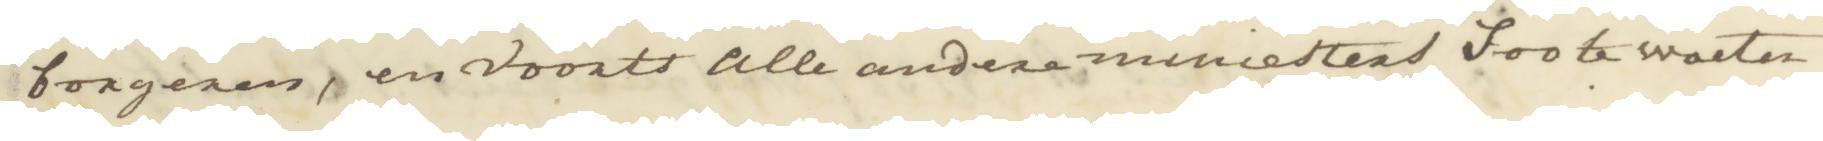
borgeren, en voorts alle andere miniesters soo te waeter
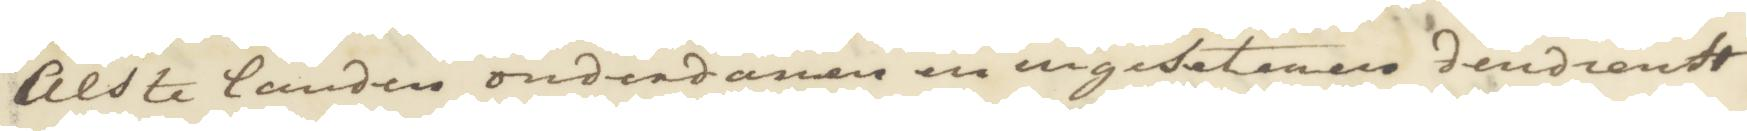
als te landen onderdanen en ingesetenen dendienst
